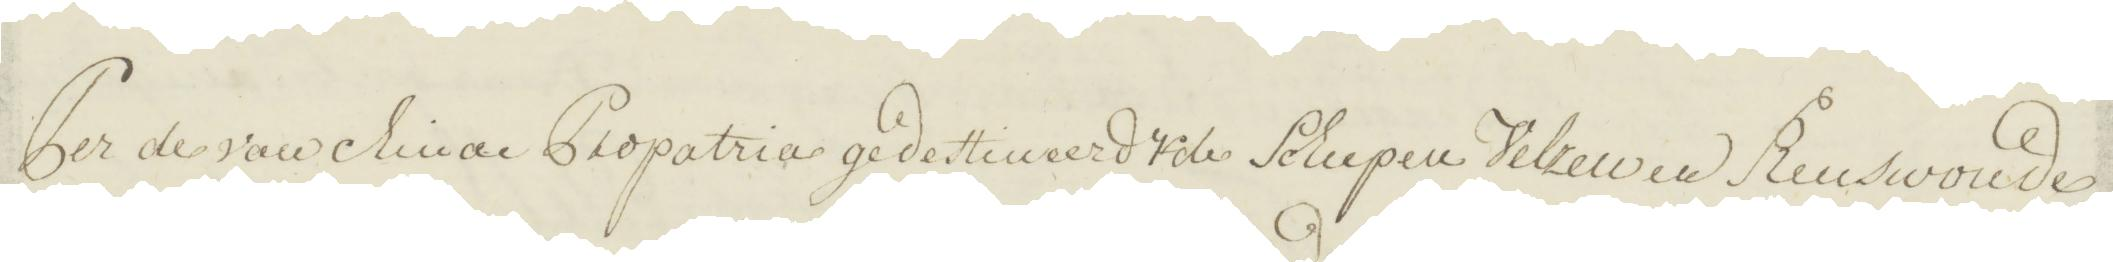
Per de van china Propatria gedestineerd r de scheepen Velzen en Renswoude
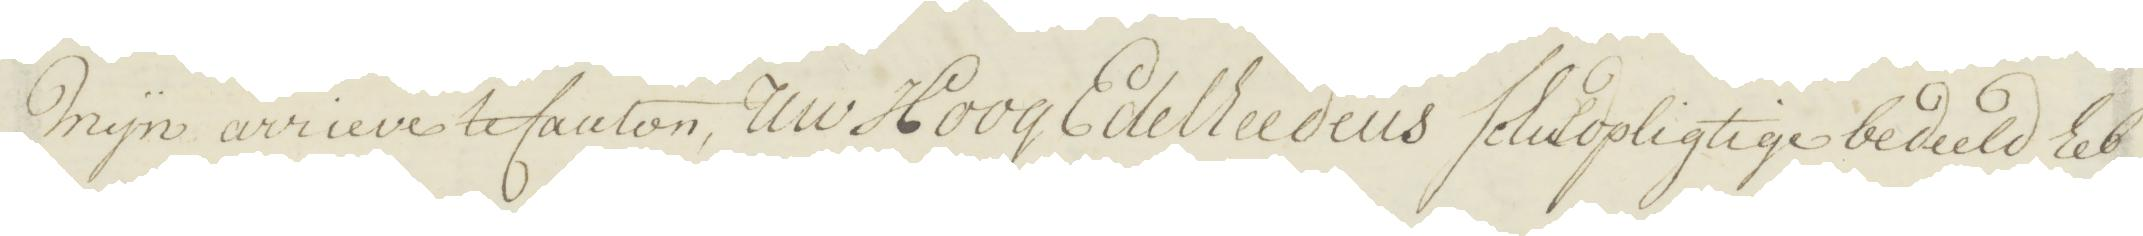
mijn arrieve te Canton, uw Hoog Edelheedens schuldpligtige bedeeld heb,
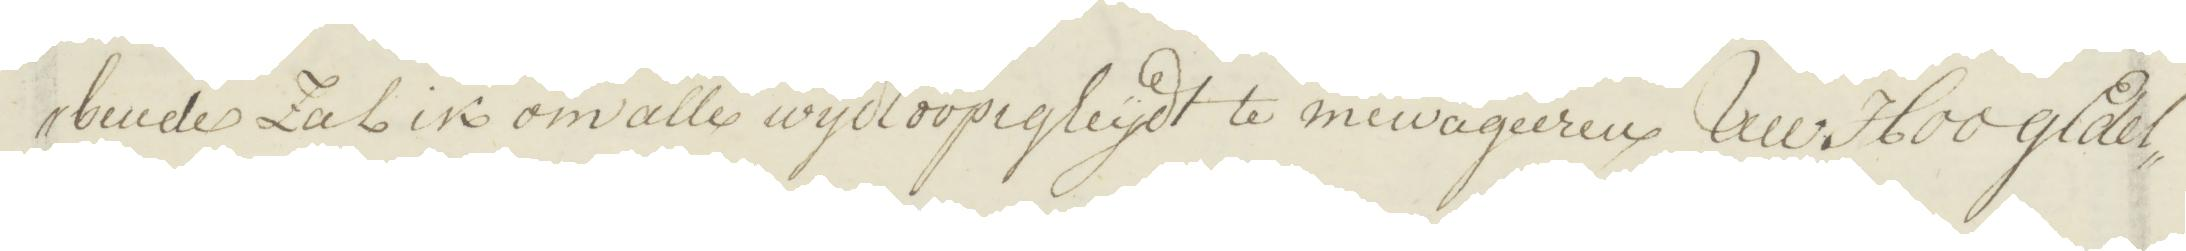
bende Zal ik om alle wijdloopigheijdt te menageeren Uw: Hoog Edel„
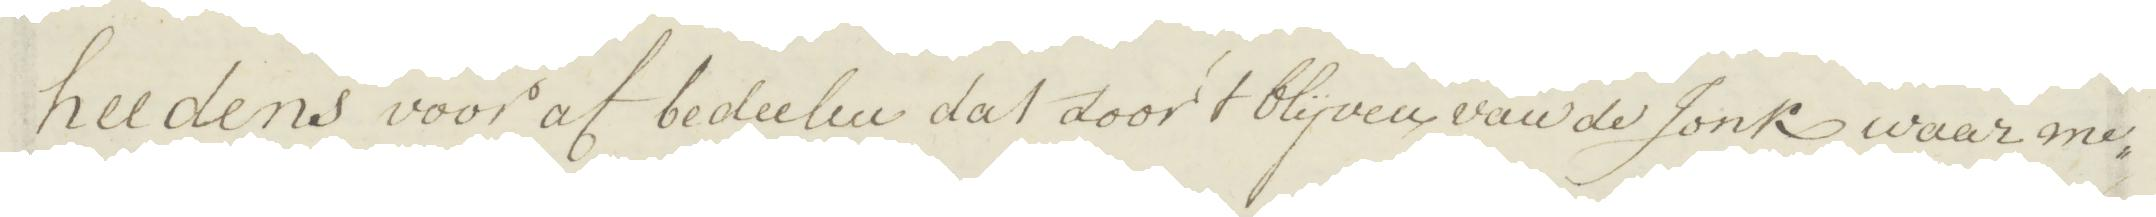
heedens voor af bedeelen dat door ’t blijven van de Jonk, waar me„
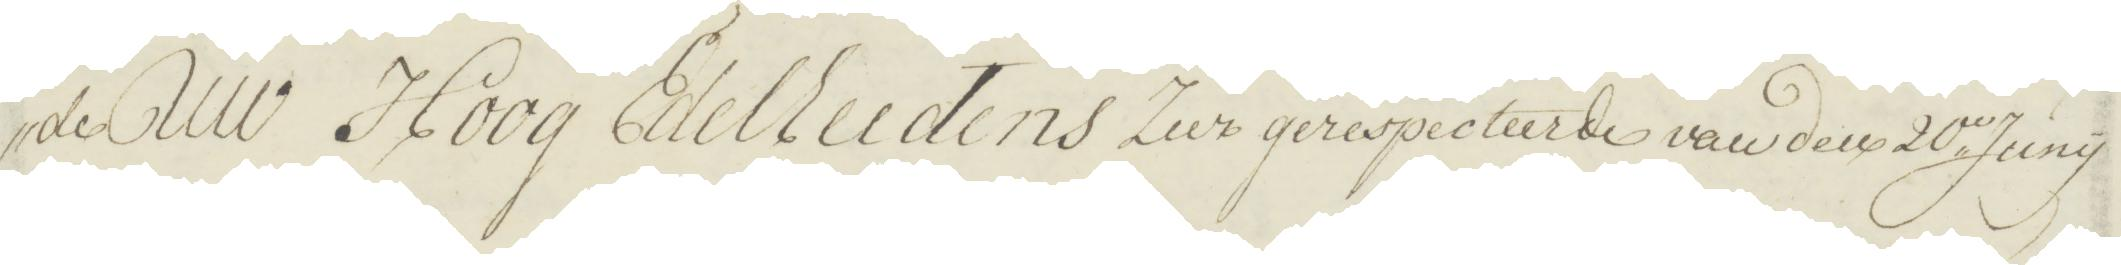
„de uw Hoog Edelheedens zeer gerespecteerde van den 20„e Junij
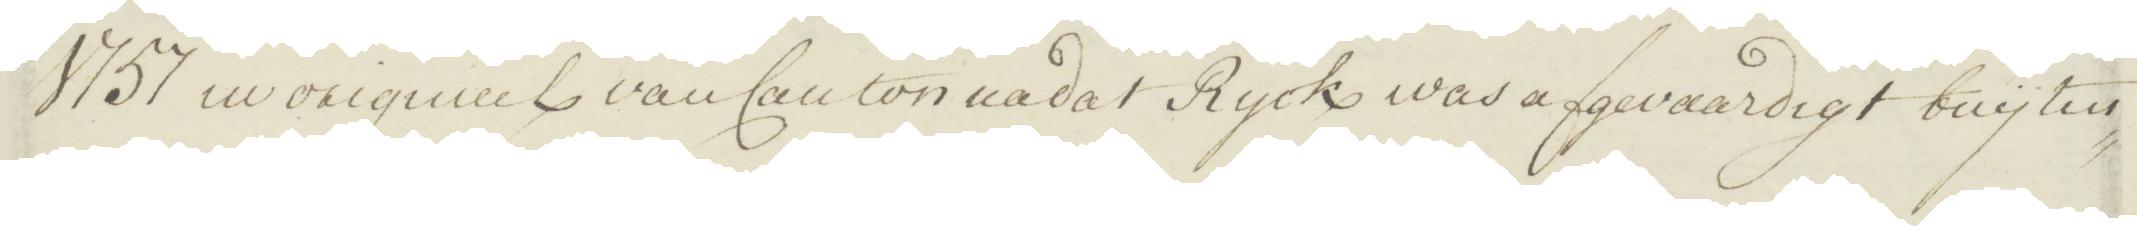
1757 in origineel van Canton nadat Ryck was afgevaardigt buijten„
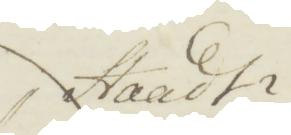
„staadt?
